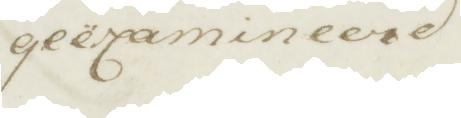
geëxamineerd
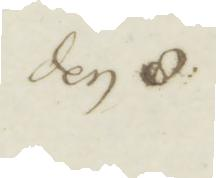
den 8:
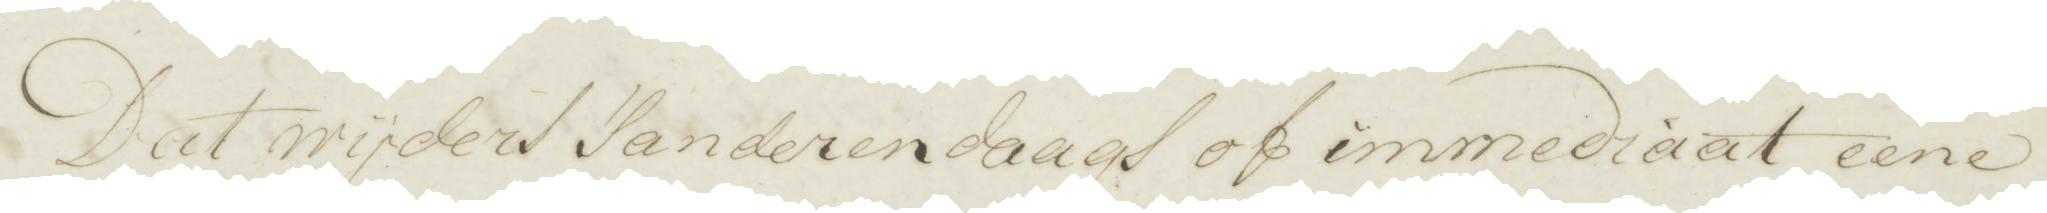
Dat wijders 'sanderendaags of immediaat eene
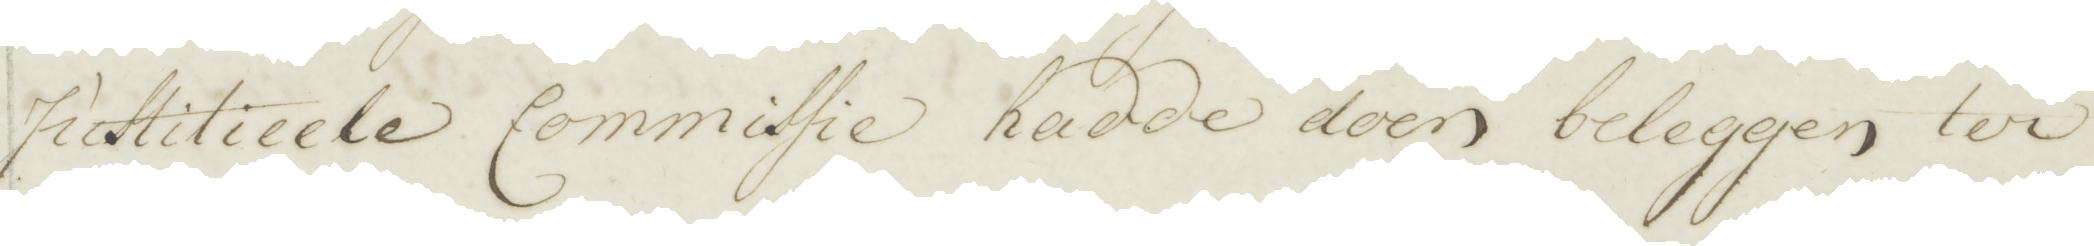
Justitieele Commissie hadde doen beleggen ter
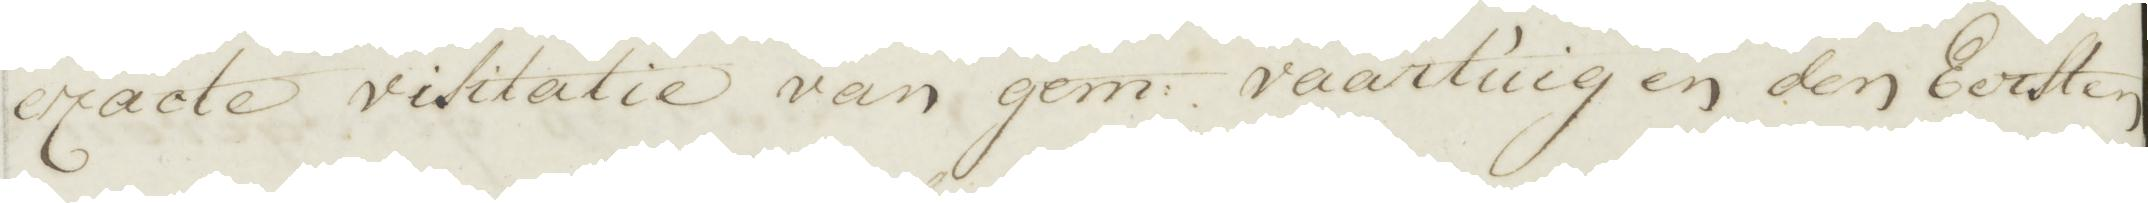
exacte visitatie van gem: vaartuig en den Eersten
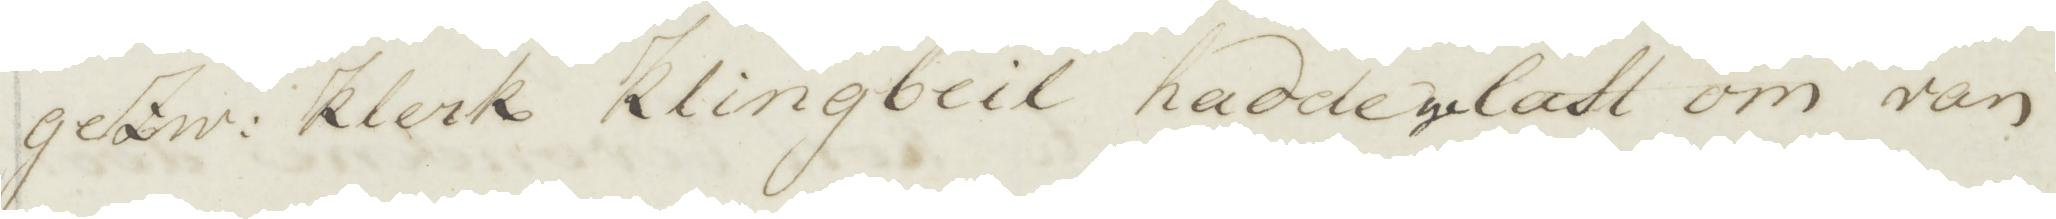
gezw: klerk Klingbeil hadde gelast om van
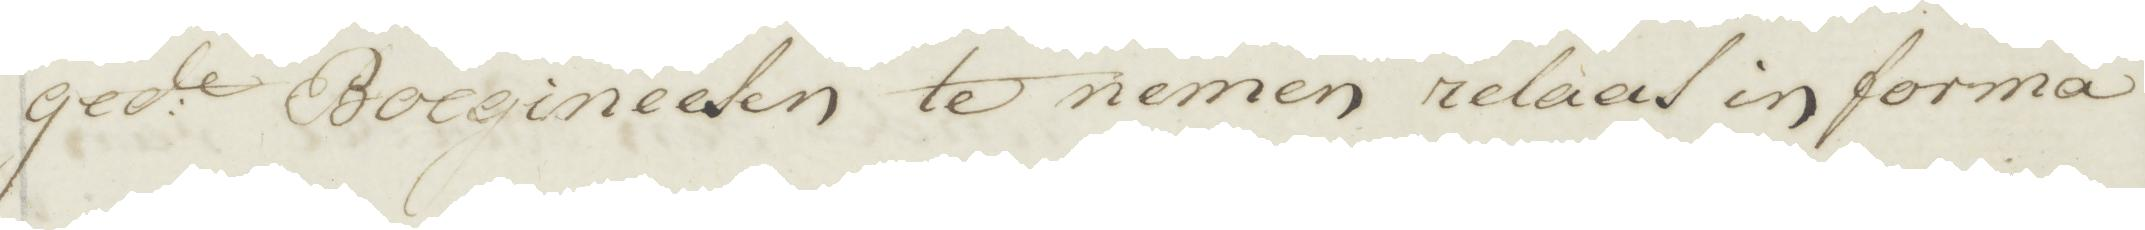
ged:e Boegineesen te nemen relaas in forma
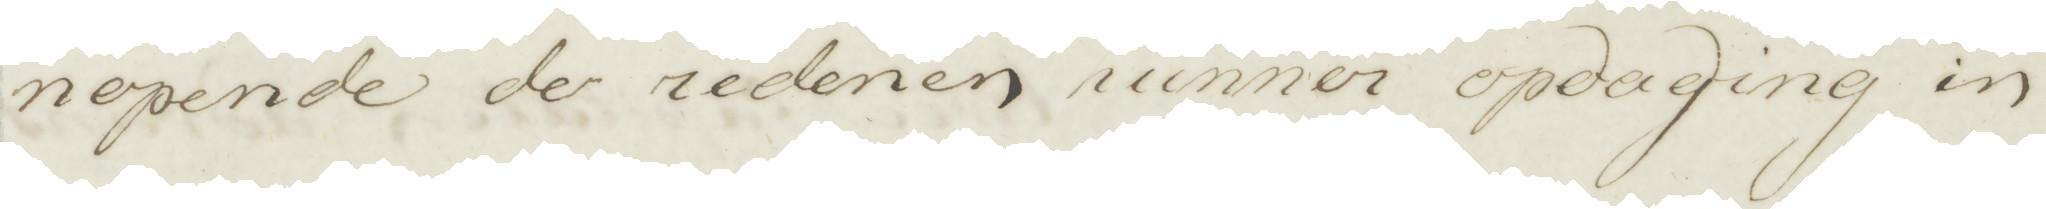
nopende de redenen hunner opdaging in
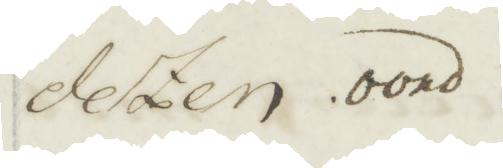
dezen .oord
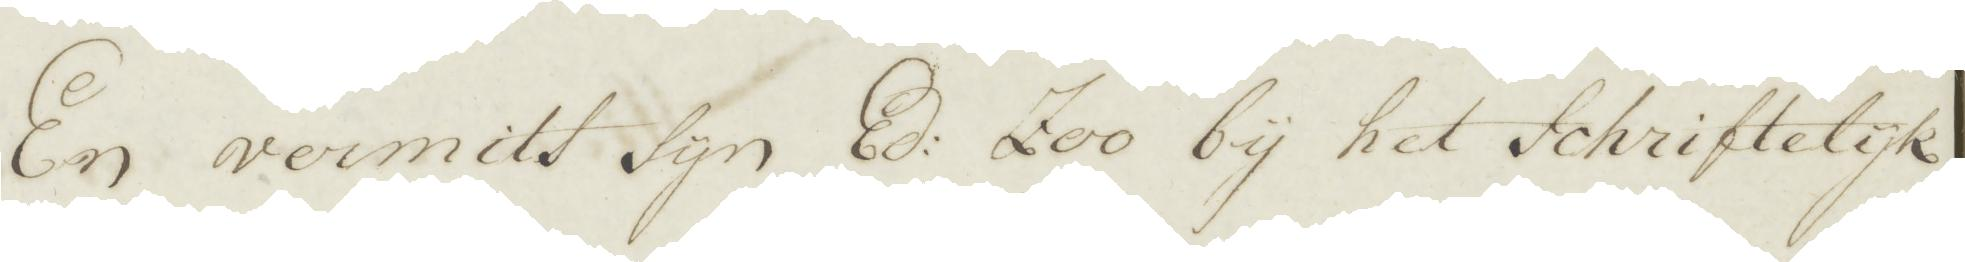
En vermits sijn Ed: zoo bij het schriftelijk
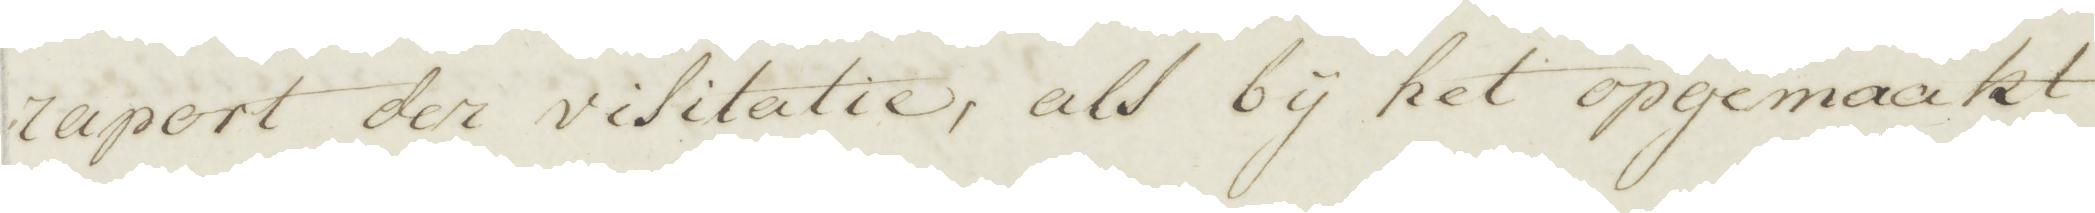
raport der visitatie, als bij het opgemaakt
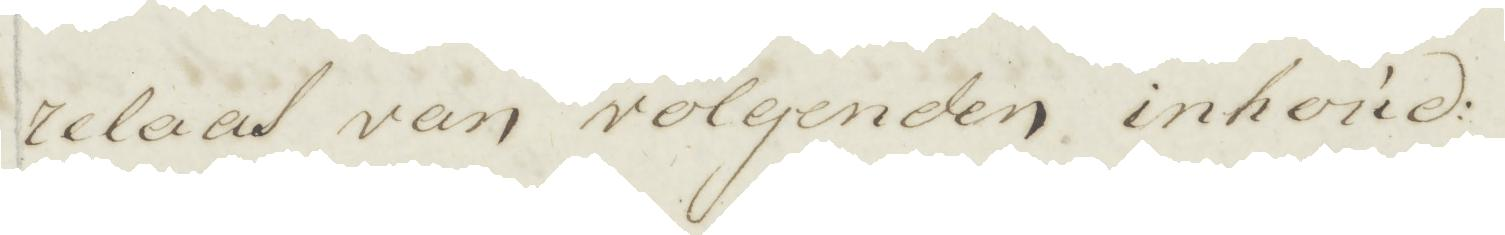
relaas van volgenden inhoud:
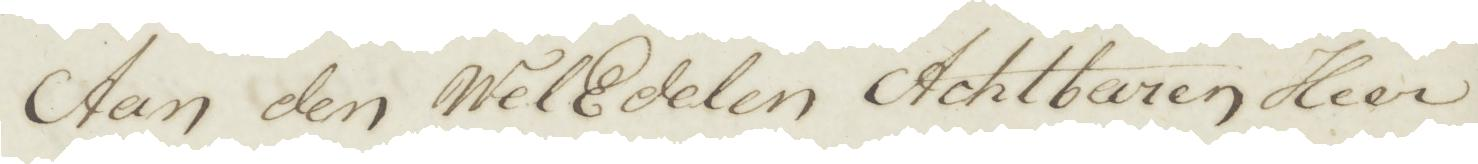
Aan den Wel Edelen Achtbaren Heer
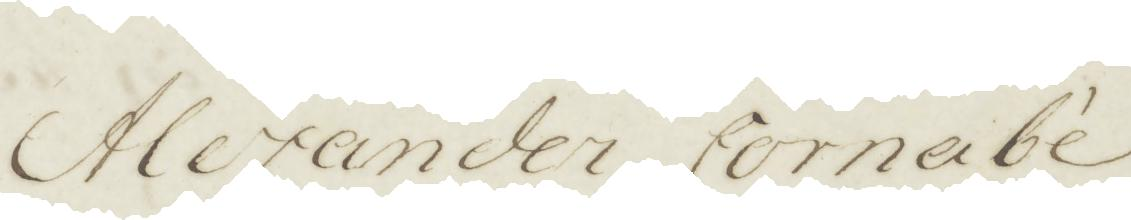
Alexander Cornabé
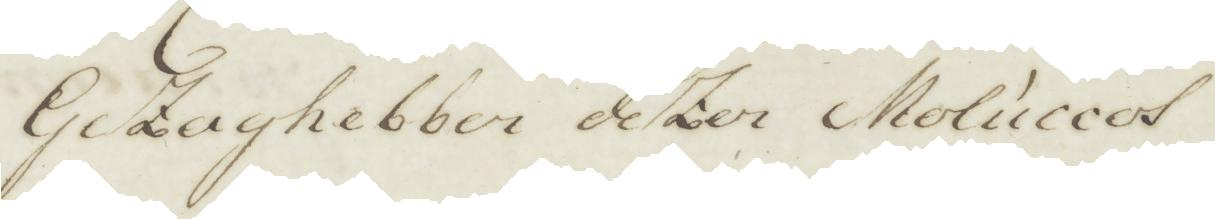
Gezaghebber dezer Moluccos
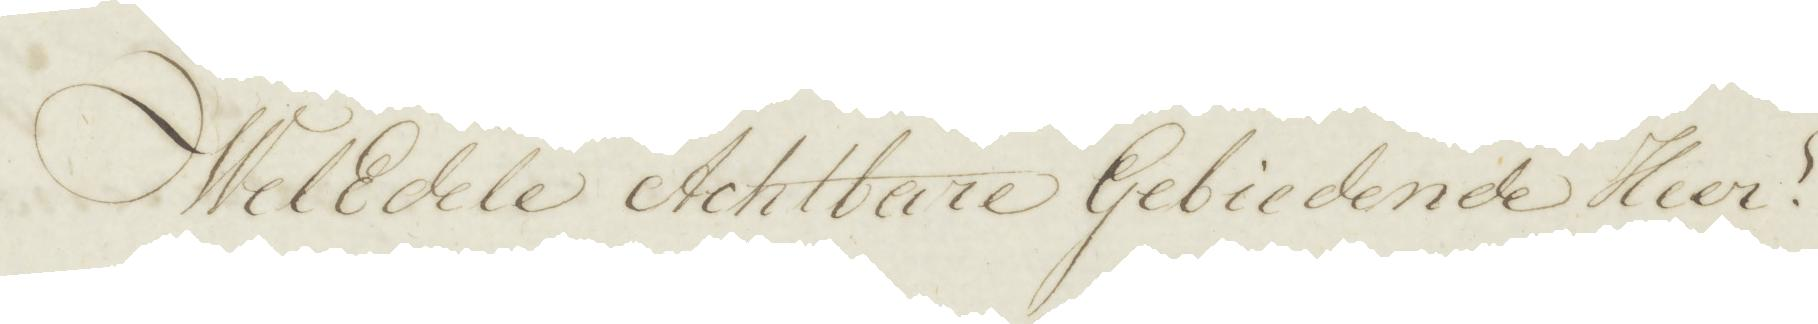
Wel Edele Achtbare Gebiedende Heer!
